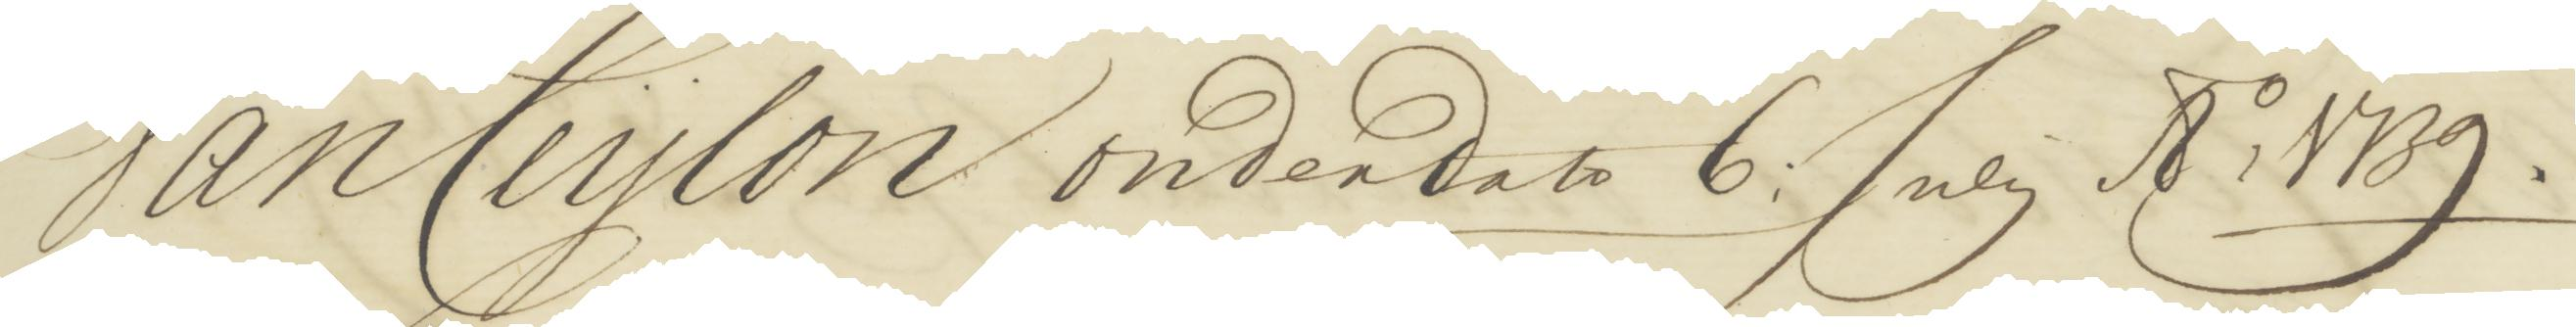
Van Ceijlon onder dato 6: Julij A:o 1739.
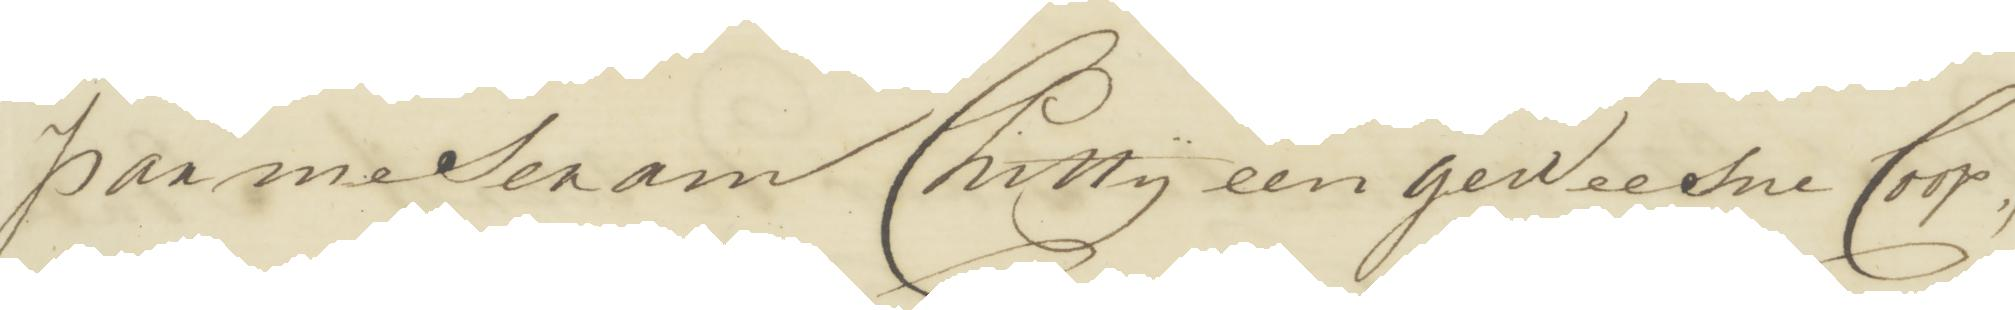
parmeseram Chittij een geweesne Coop„
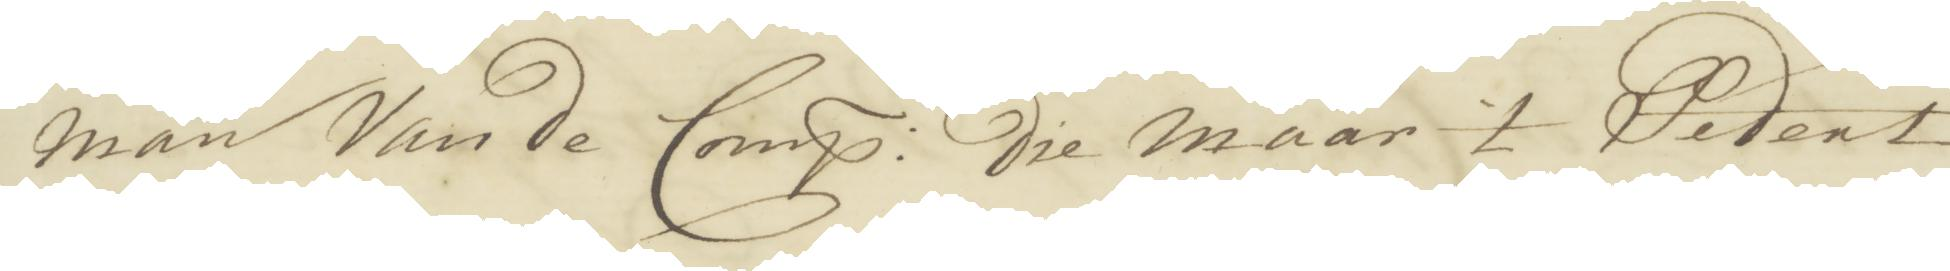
man van de Comp: die maar ’t sedert
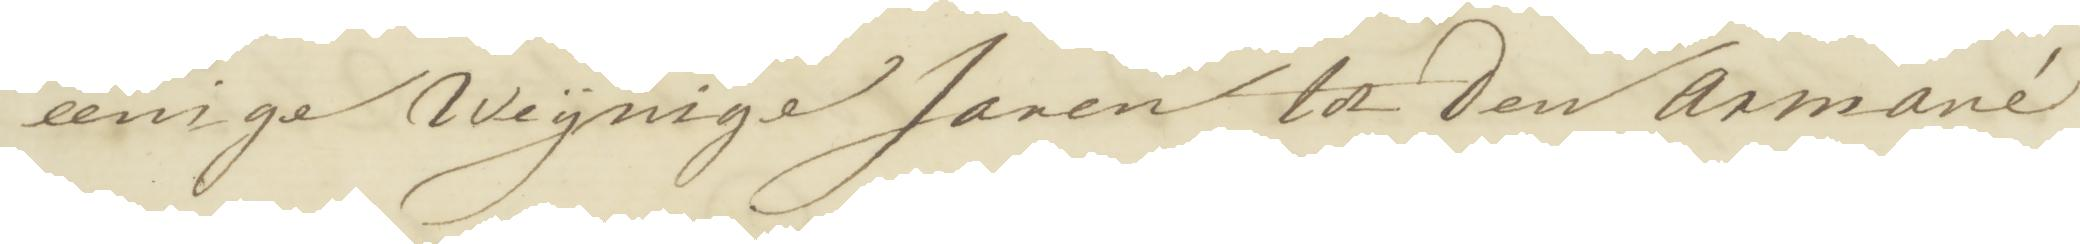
eenige weijnige Jaren tot den Armané
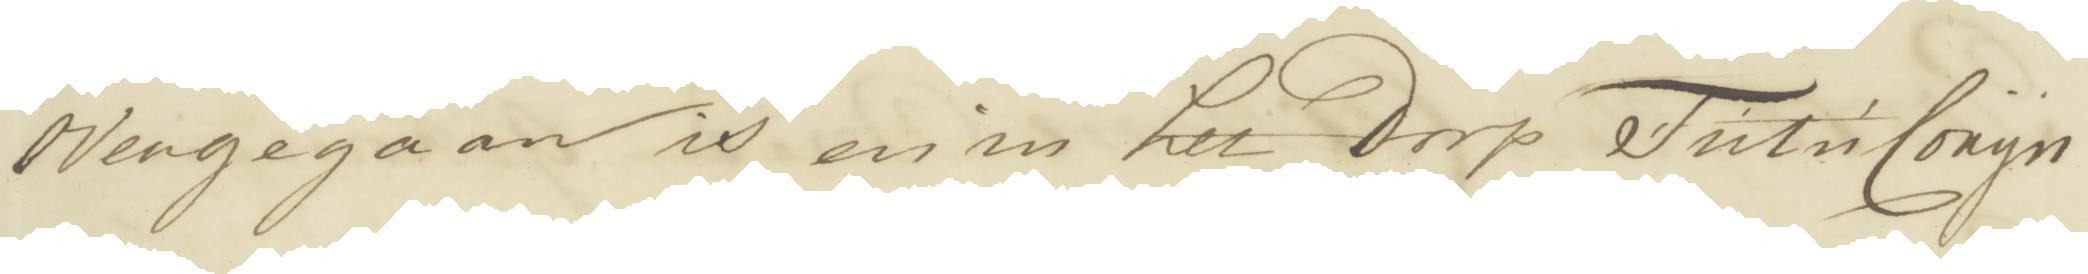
overgegaan is, en in het dorp Tutu Corijn
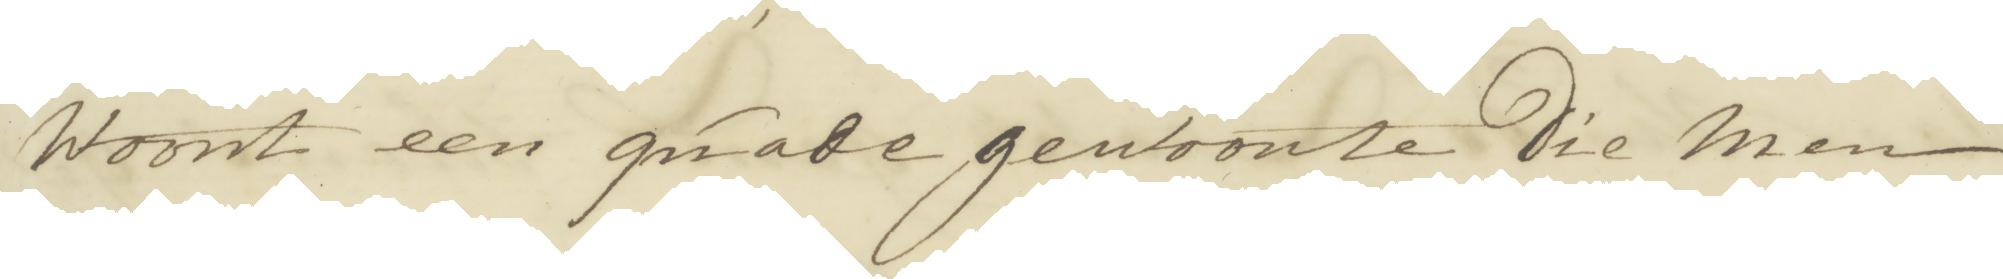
woont een quade gewoonte die men
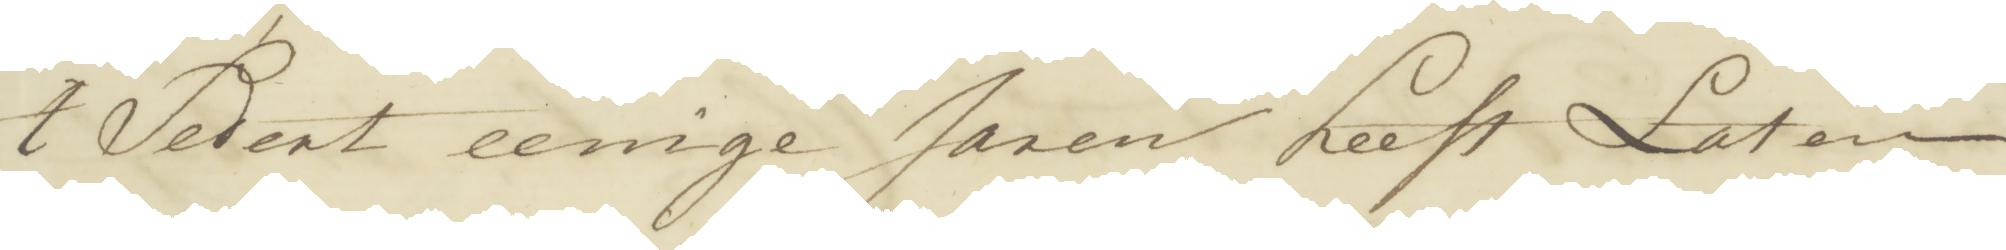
’t sedert eenige Jaren heeft Laten
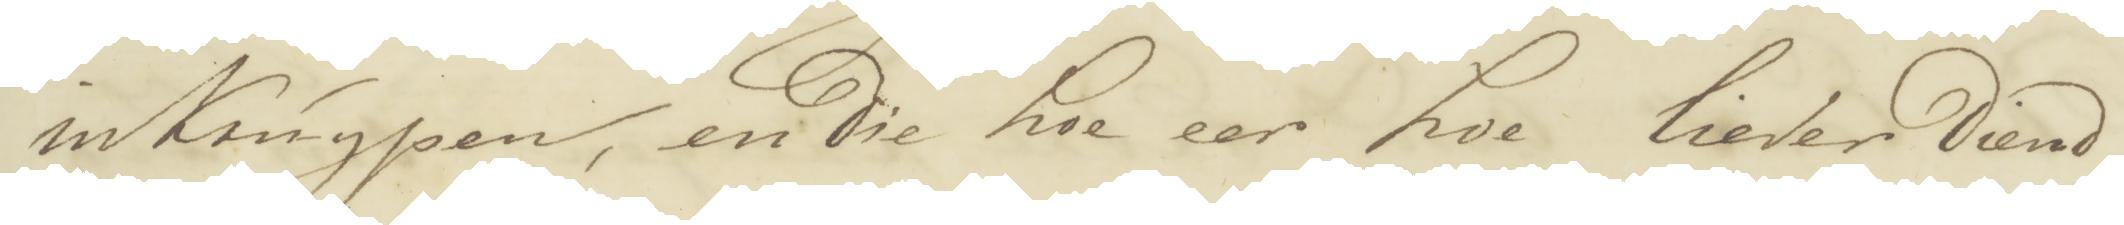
inkruijpen, en die hoe eer hoe lieven diend
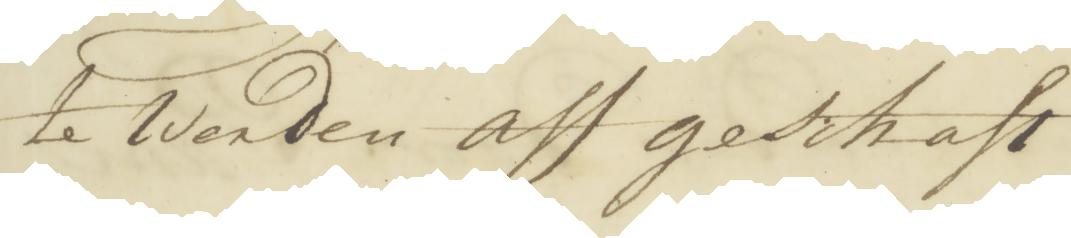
te werden aff geschaft
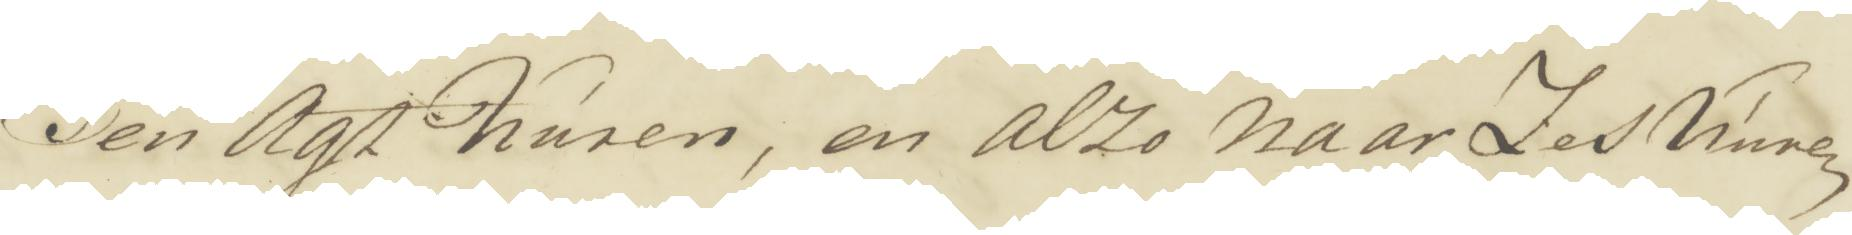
Ten Agt Uuren, en alzo naar Zes Uuren
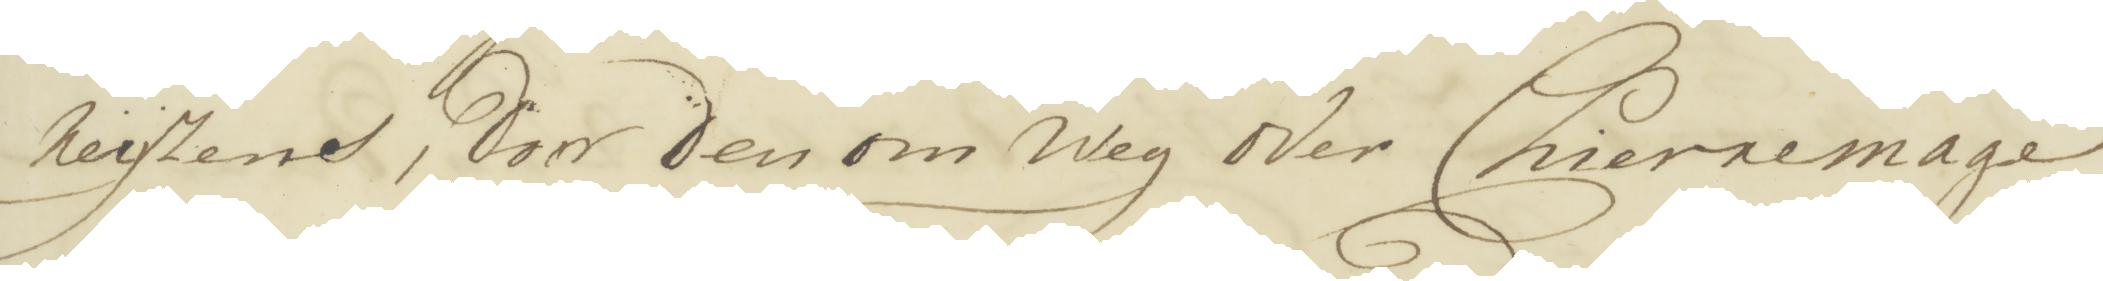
reijzens, door den om weg over Chierremage
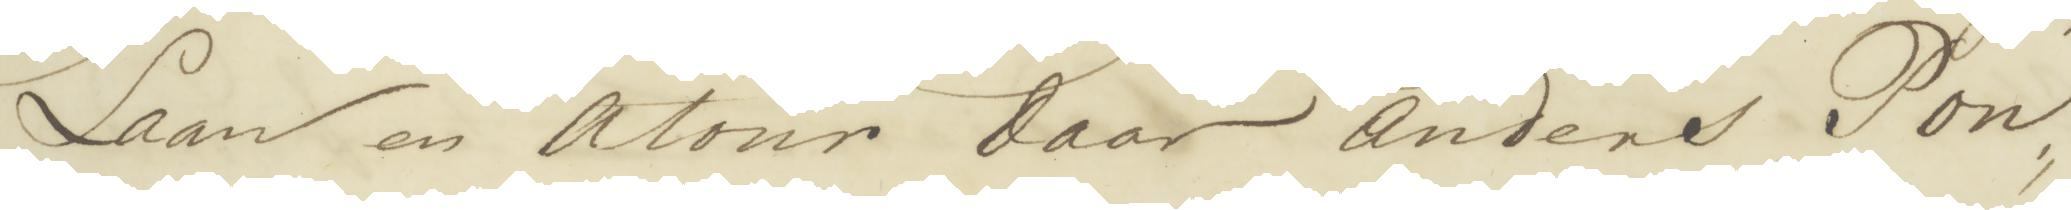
Laan en Atour door Anders Pon„
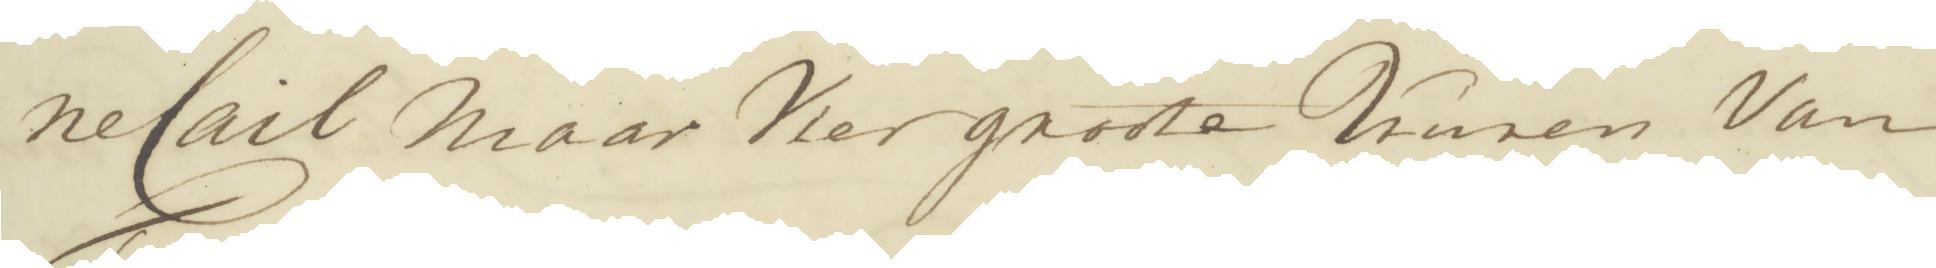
necail maar Vier groote uuren van
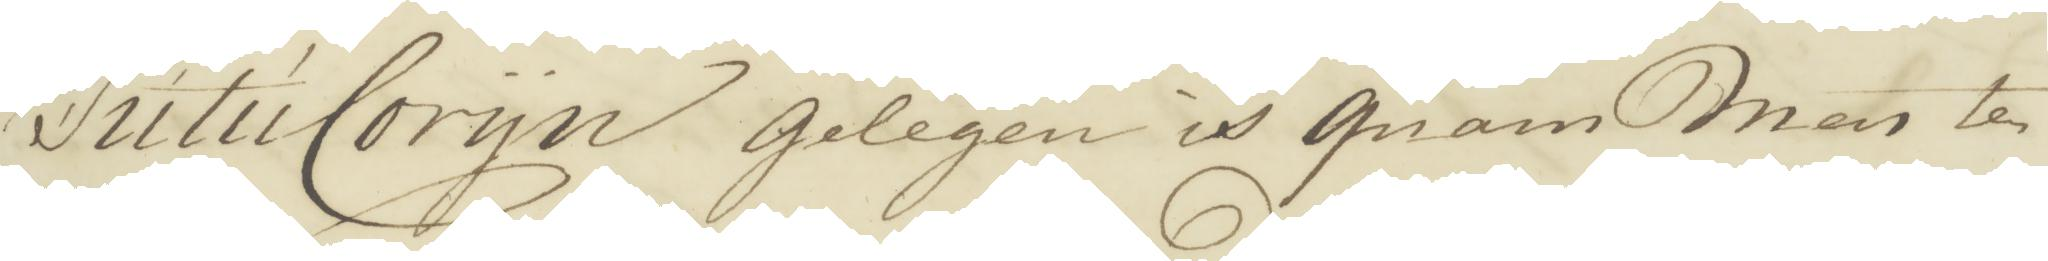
Tutu Corijn gelegen is quam men ten
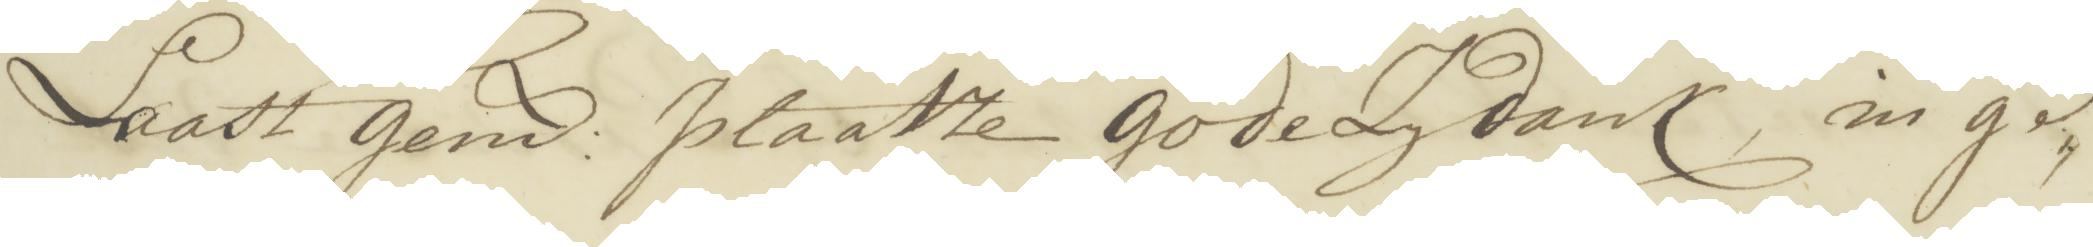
Laast gem: plaatze gode zy dank, in ge„
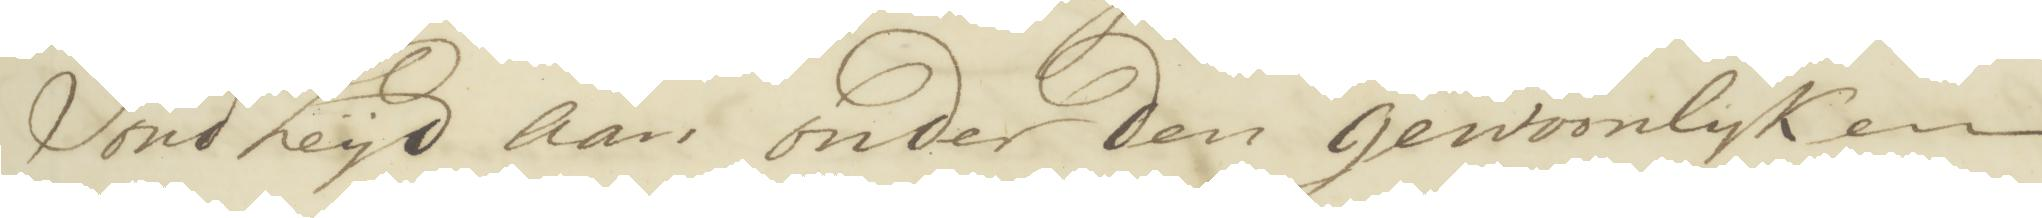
sondheijd aan onder den gewoonlijken
